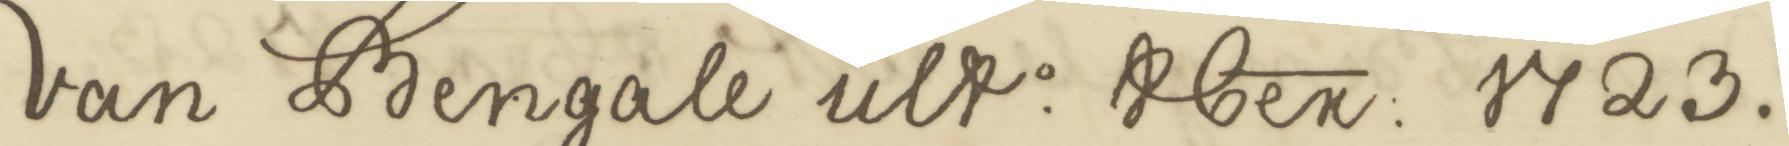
van Bengale ult:o 8ber: 1723.
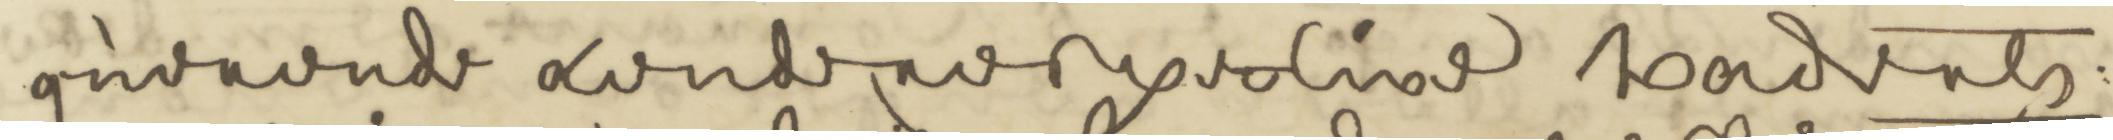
querende aen de respective vaderlijk
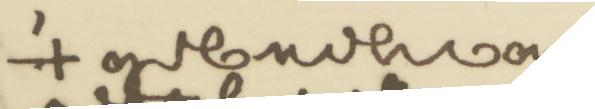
't gebrek van
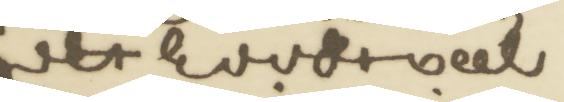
gelt heeft veel
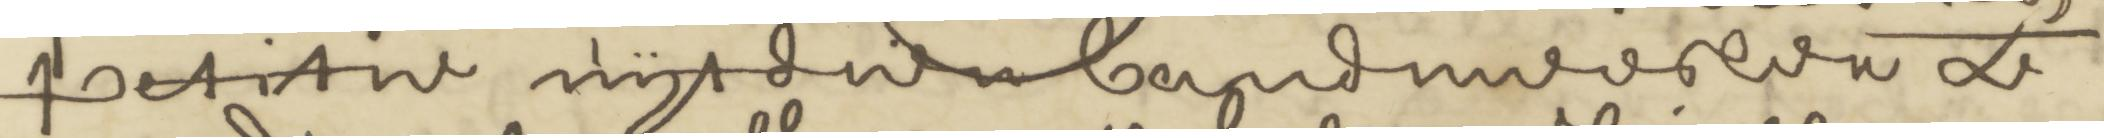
petitie uijt dien bandmeester te
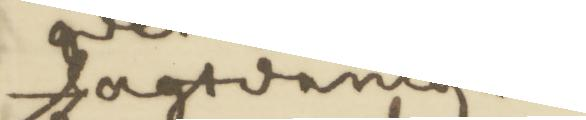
veragtering in
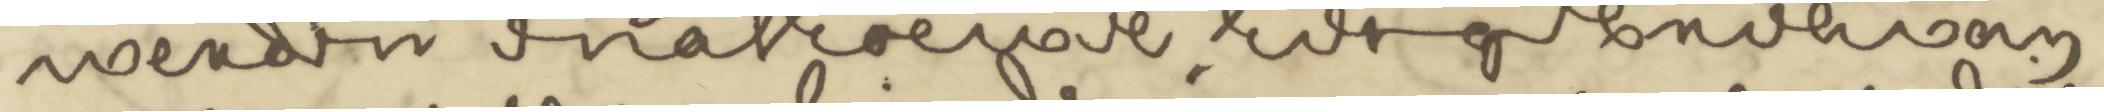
werden en alhoewel het gebrek van
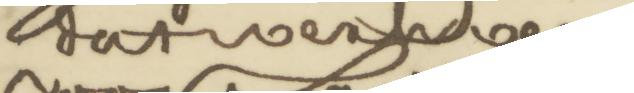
dat werk ver
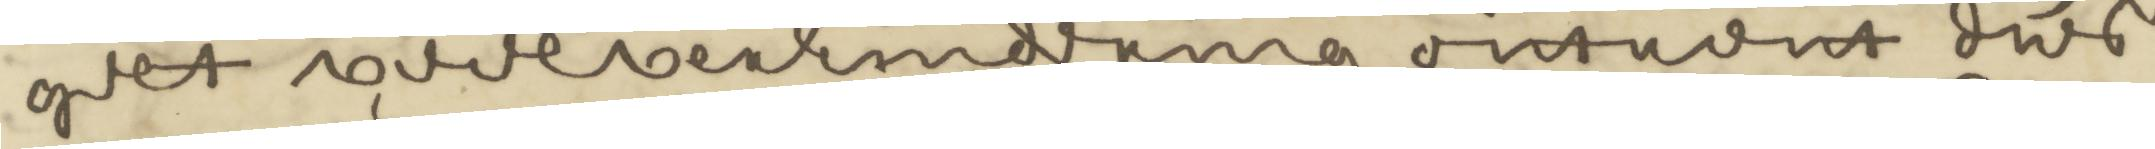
gelt veel verhindering ontrent dies
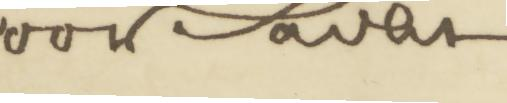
oorsaekt
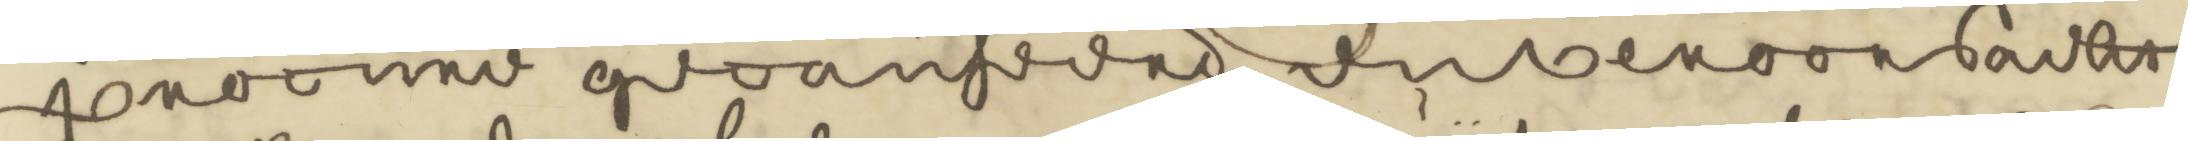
procure gecauseerd en veroorsaekt
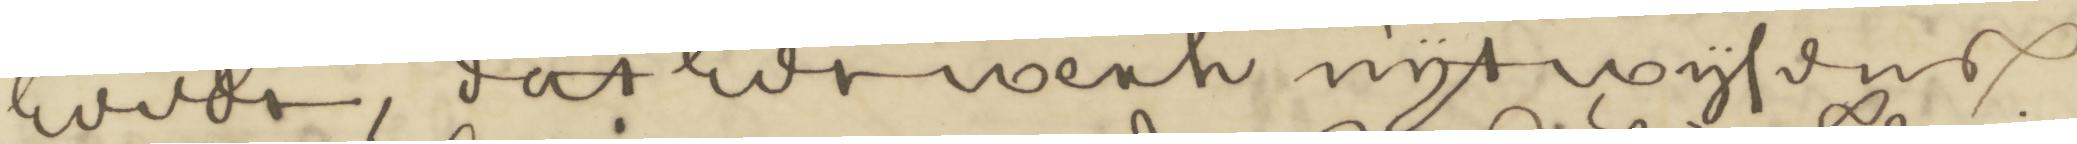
heeft, dat het werk uijt wijsens
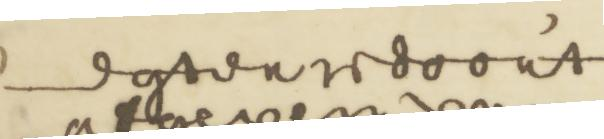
egter is door't
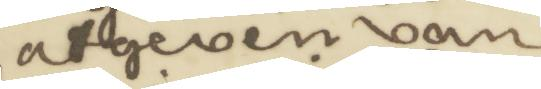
afgeven van
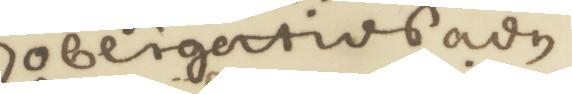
obligaties aen
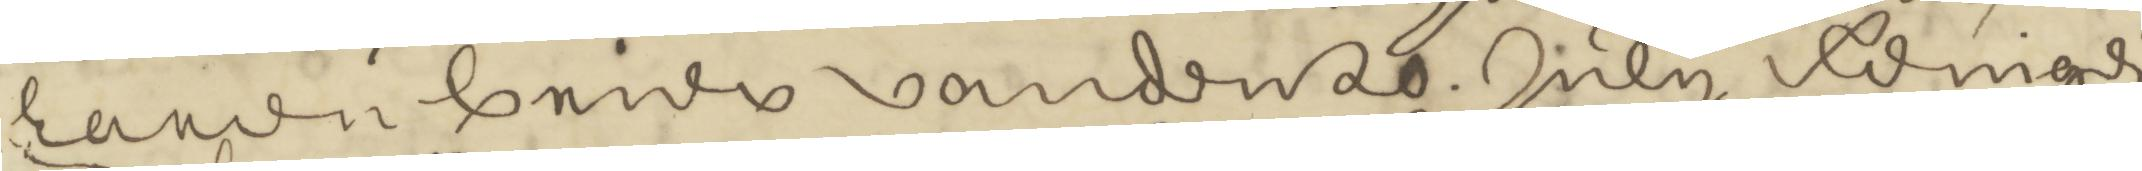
haren briev van den 20. Julij Eenigen
